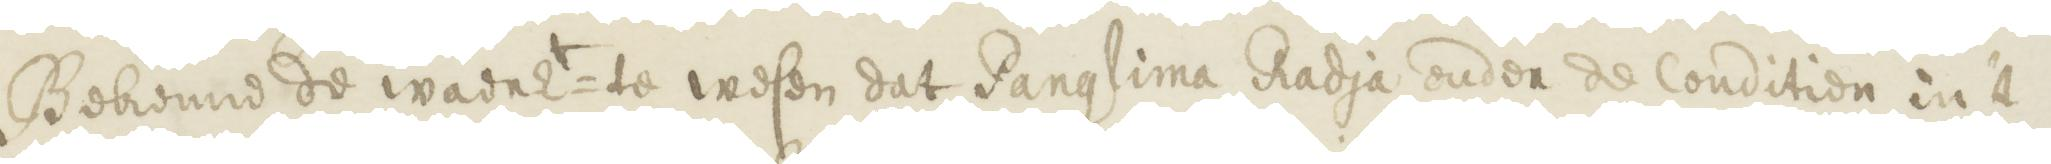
Bekenne de waer=t te wesen dat Panglima Radja onder de conditien in ’t
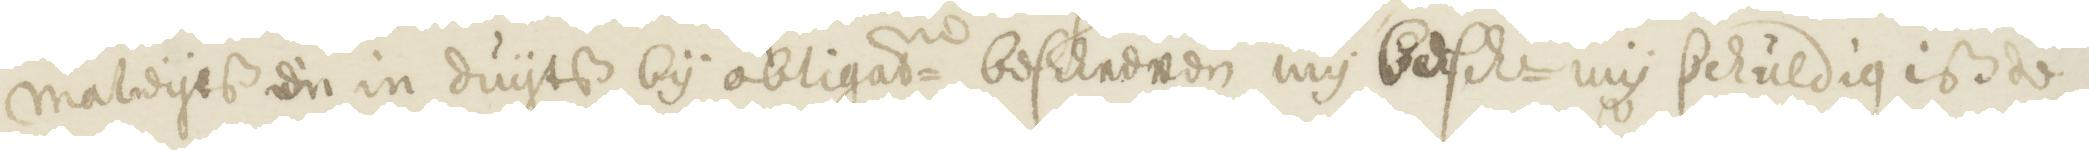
maleijts en in duijts bij obtigat= beschreven mij behsch= mij schuldig is de
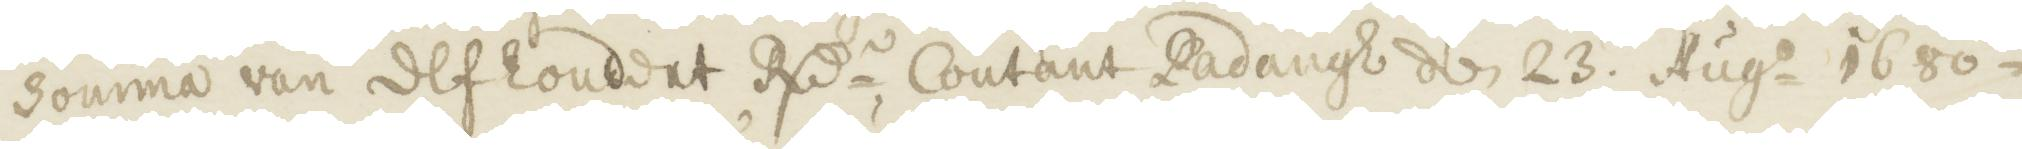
somma van elfhondert Rd=s contant Padangh den 23.' Aug=o 1680
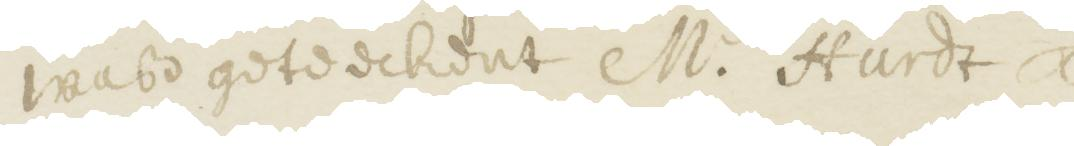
was geteeckent M.' Hurdt
